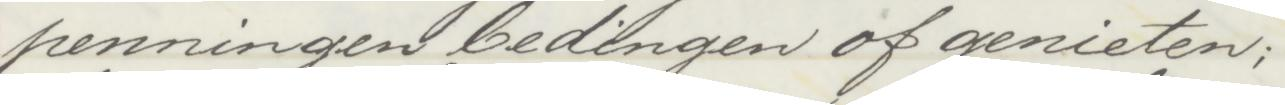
penningen bedingen of genieten:
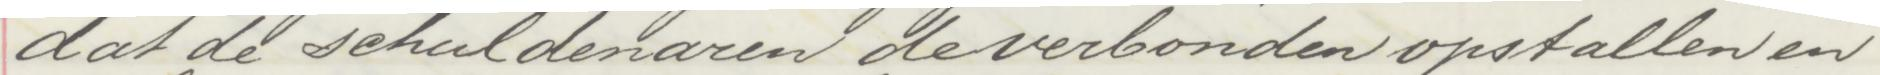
dat de schuldenaren de verbonden opstallen en
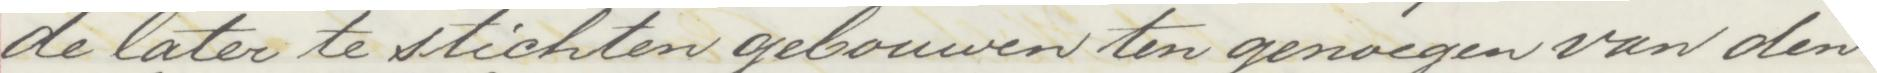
de later te stichten gebouwen ten genoegen van den
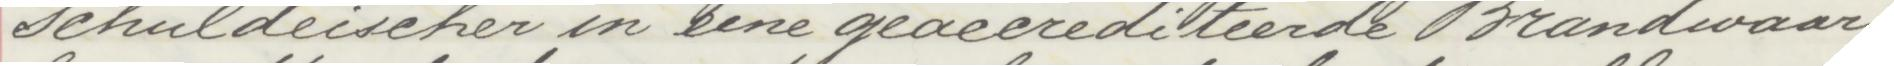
schuldeischer in eene geaccrediteerde Brandwaar
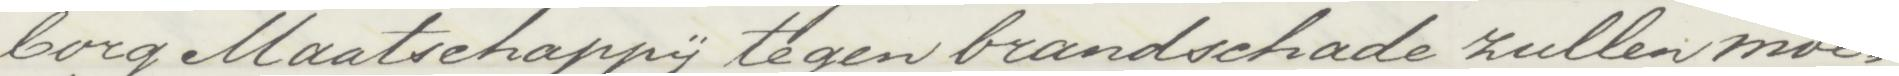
borg Maatschappij tegen brandschade zullen moe=
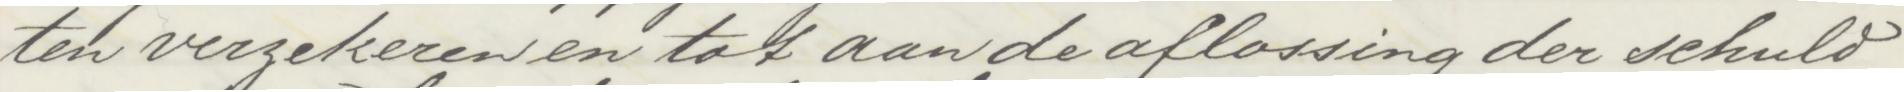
ten verzekeren en tot aan de aflossing der schuld
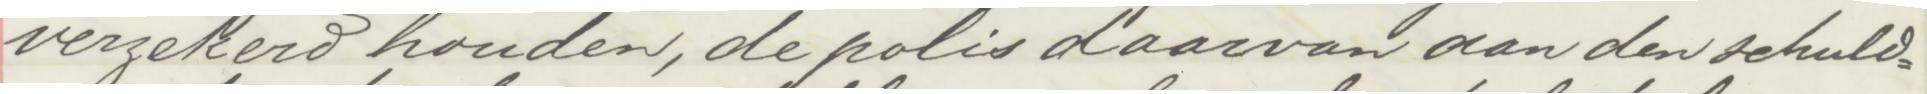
verzekerd houden, de polis daarvan aan den schuld=
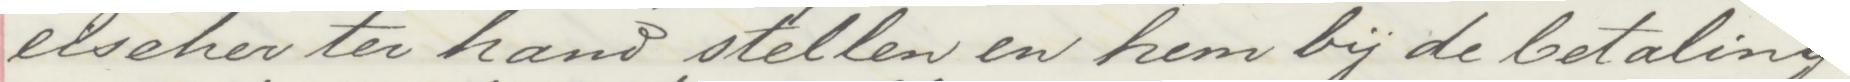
eischer ter hand stellen en hem bij de betaling
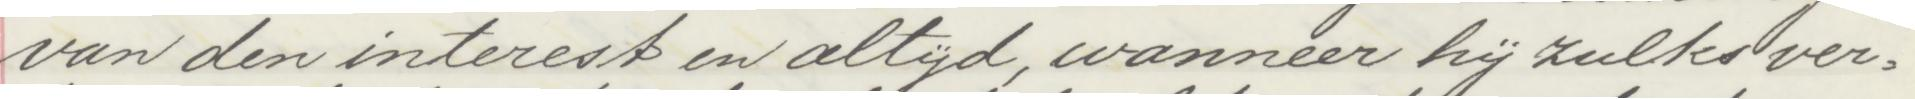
van den interest en altijd, wanneer hij zulks ver=
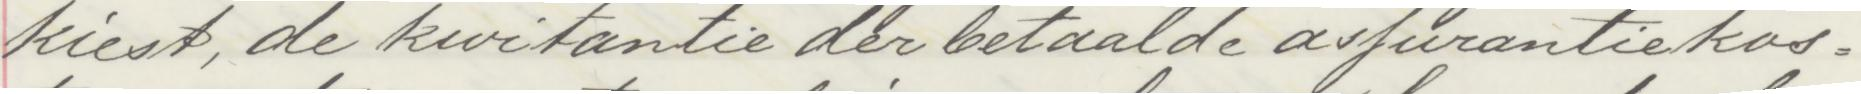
kiest, de kwitantie der betaalde assurantie kos=
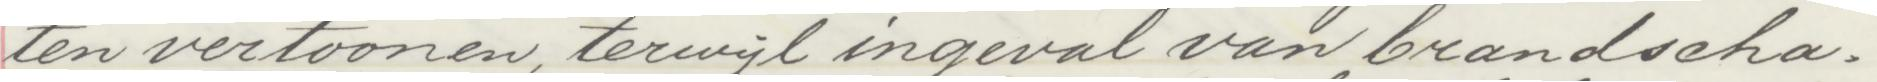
ten vertoonen, terwijl ingeval van brandscha=
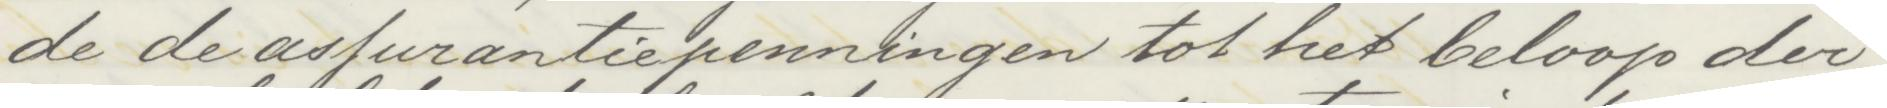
de de assurantiepenningen tot het beloop der
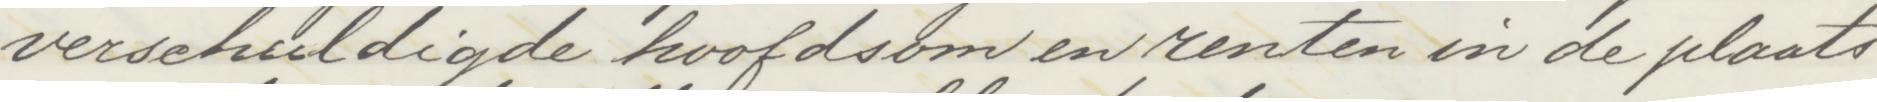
verschuldigde hoofdsom en renten in de plaats
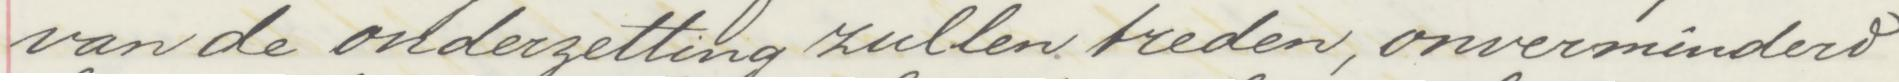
van de onderzetting zullen treden, onverminderd
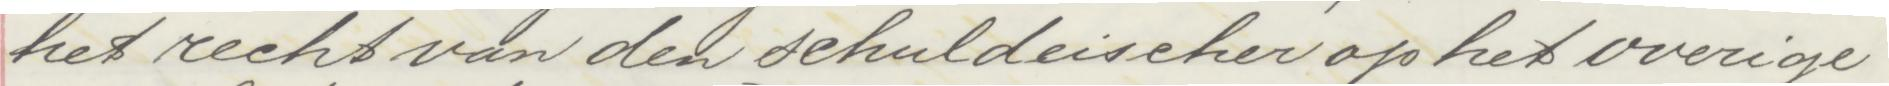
het recht van den schuldeischer op het overige
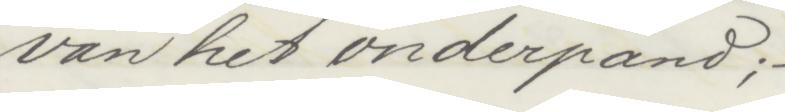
van het onderpand;
